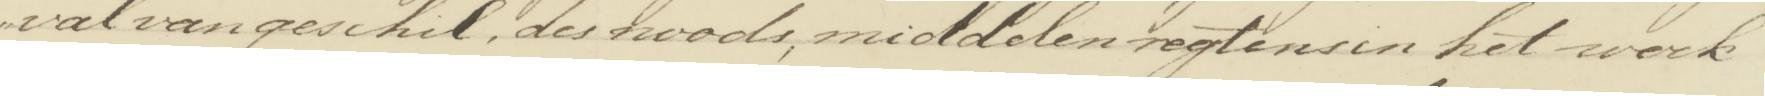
val van geschil, des noods, middelen regtens in het werk
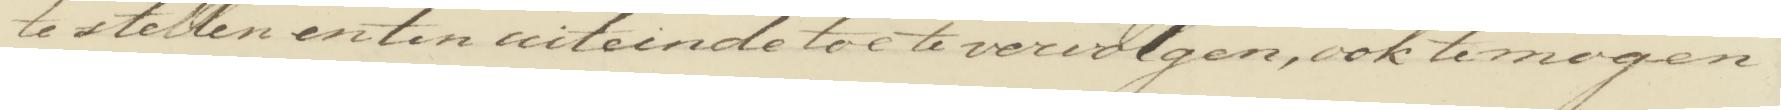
te stellen en ten uiteinde toe te vervolgen, ook te mogen
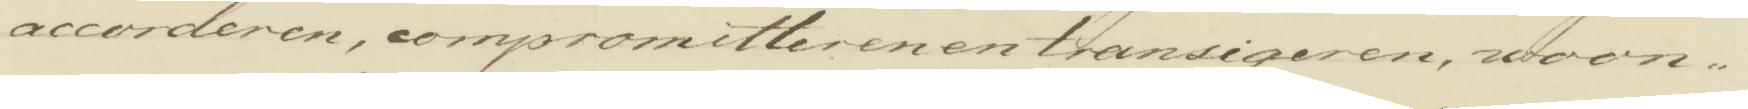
accorderen, compromitteren en transigeren, woon„
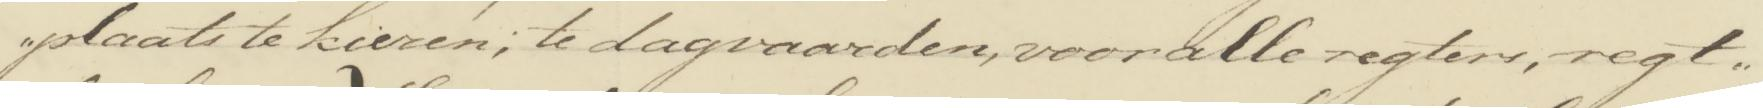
„plaats te kiezen; te dagvaarden, voor alle regters, regt„
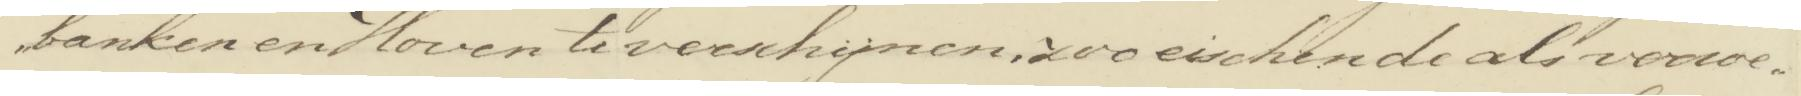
„banken en Hoven te verschijnen zoo eischende als verroe„
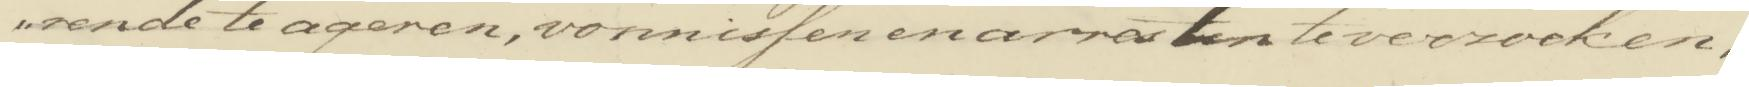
„rende te ageren, vonnissen en arresten te verzoeken,
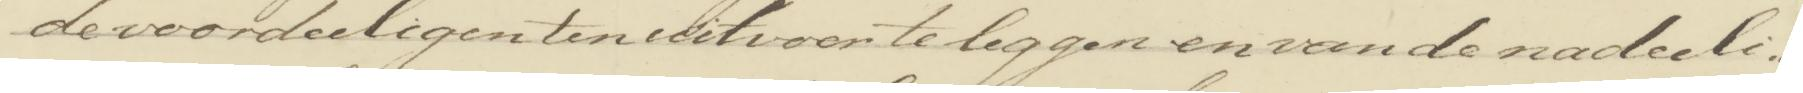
de voordeeligen ten uitvoer te leggen en van de nadeeli„
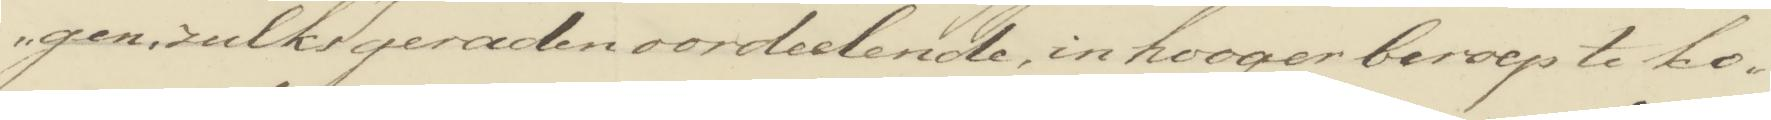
„gen, zulks geraden oordeelende, in hooger beroep te ko„
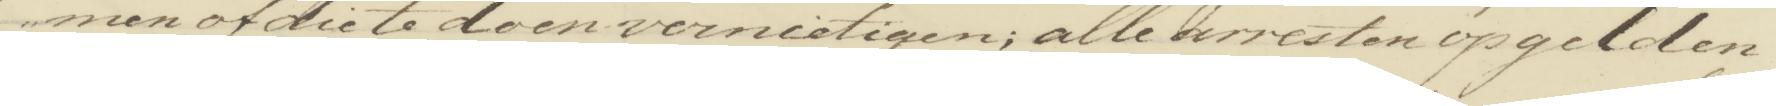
„men, of die te doen vernietigen; alle arresten opgelden
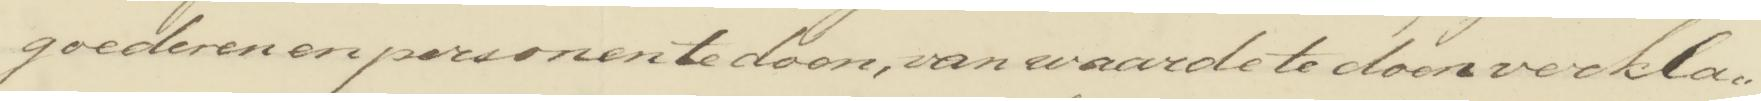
goederen en personen te doen, van waarde te doen verkla„
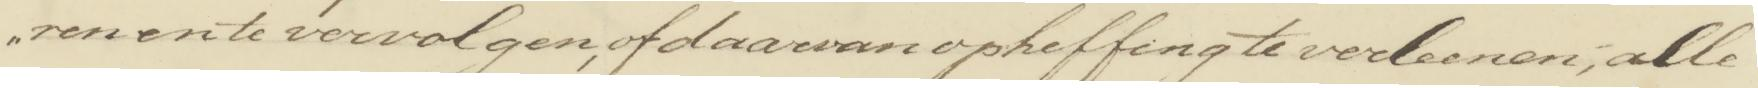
„ren en te vervolgen, of daarvan opheffing te verleenen; alle
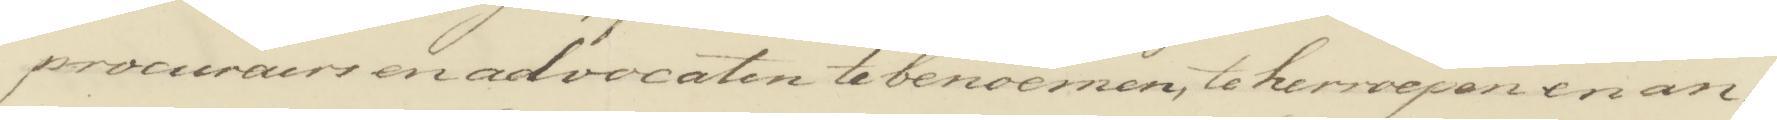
procurairs en advocaten te benoemen, te herroepen en an
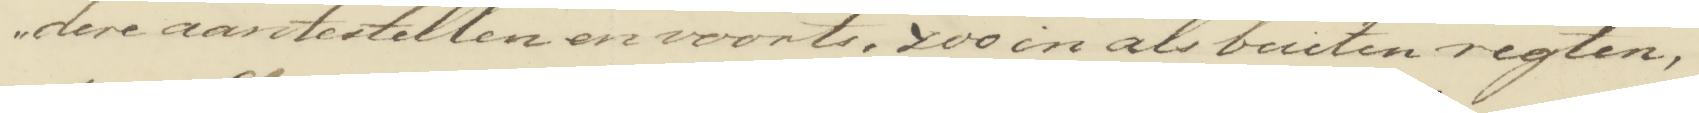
„dere aan testellen en voorts, zoo in als buiten regten,
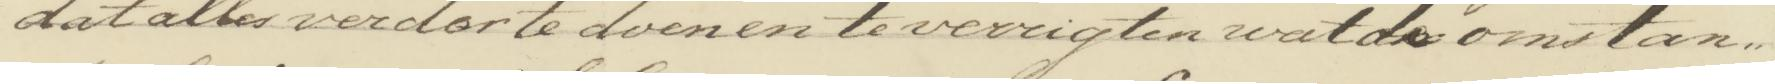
dat alles verder te doen en te verrigten wat de omstan„
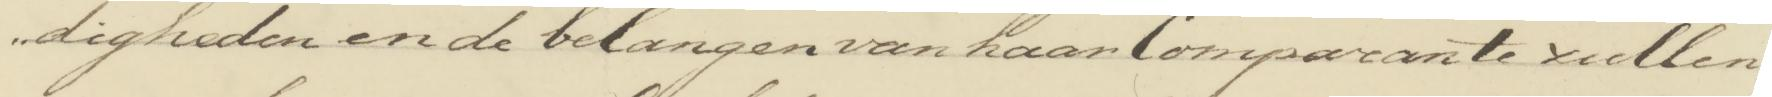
„digheden en de belangen van haar Comparante zullen
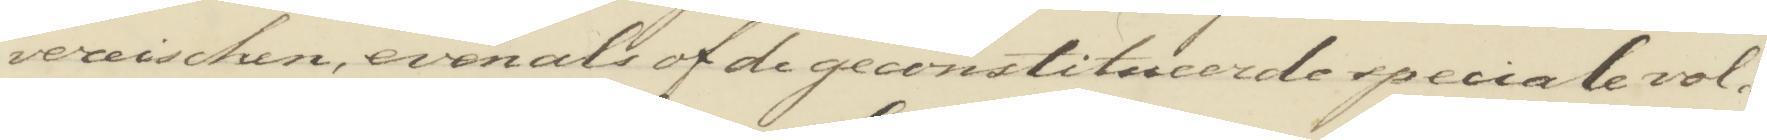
vereischen, even als of de geconstitueerde speciale vol„
